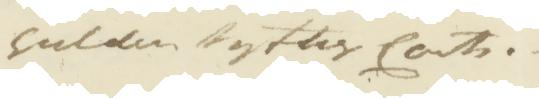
gulden vyftig Cents.
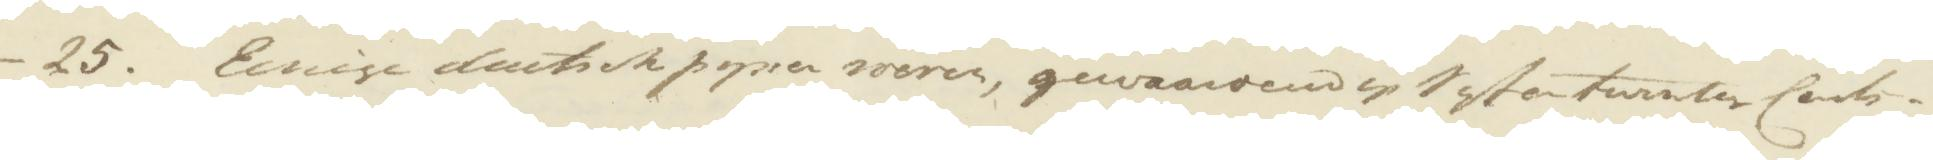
— 25. Eenige duitsch papierwaren, gewaardeerd op Vyf en twintig Cents-
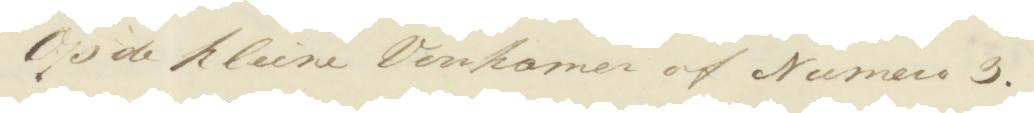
Op de kleine Voorkamer of Numero 3.
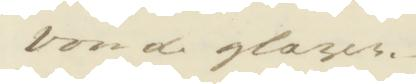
voor de glazen.
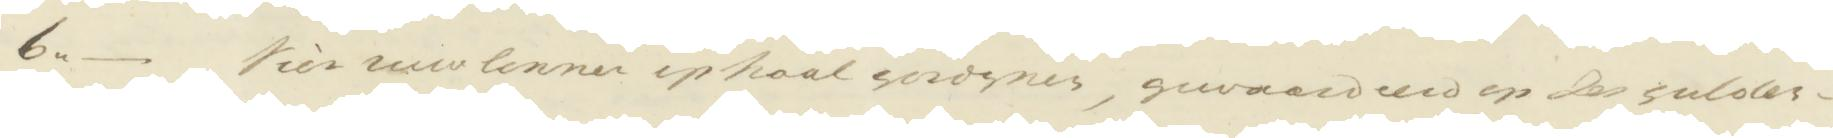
6: — Vier ruwlinnen op haalgordynen, gewaardeerd op zes gulden.
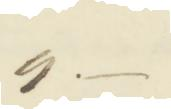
9. —
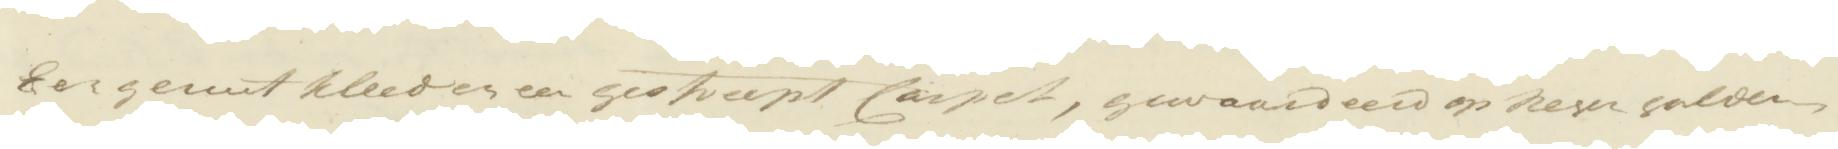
Een geruit kleed en een gestreept Carpet, gewaardeerd op negen gulden
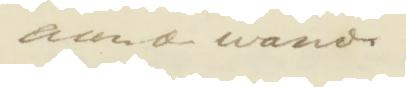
aan de wanden
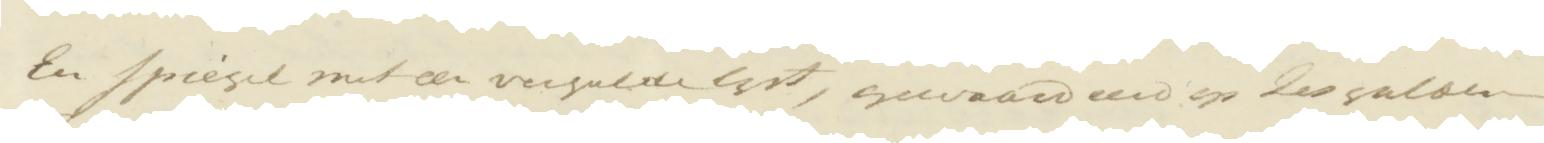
En spiegel met een vergulde lyst, gewaardeerd op zes gulden
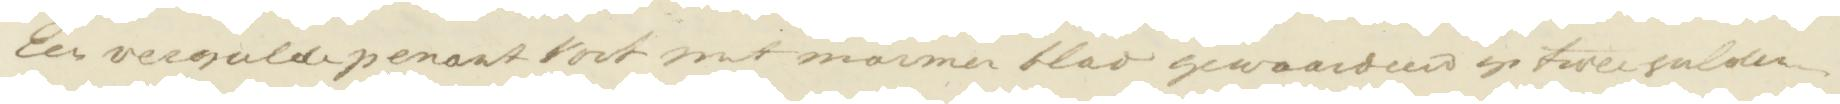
Een vergulde penant voet met marmer blad gewaardeerd op twee gulden
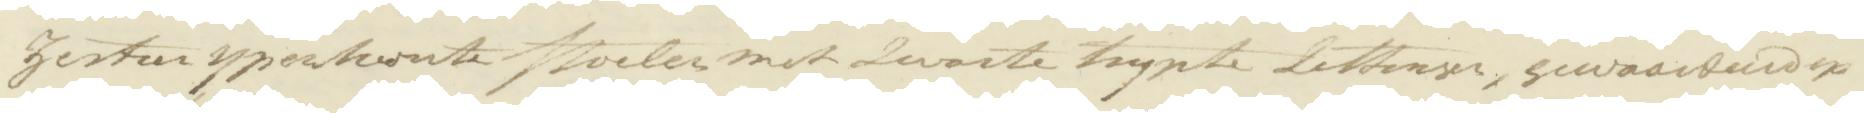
Zestien Yperhoute stoelen met Zwarte trypte Zittingen, gewaardeerd op
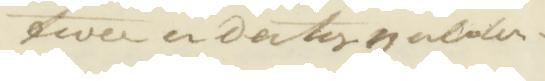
twee en dertig gulden
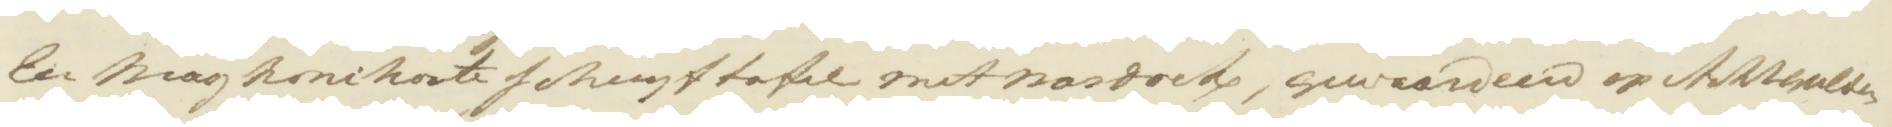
Een maghonihoute schryftafel met wasdoek, gewaardeerd op Achtgulden
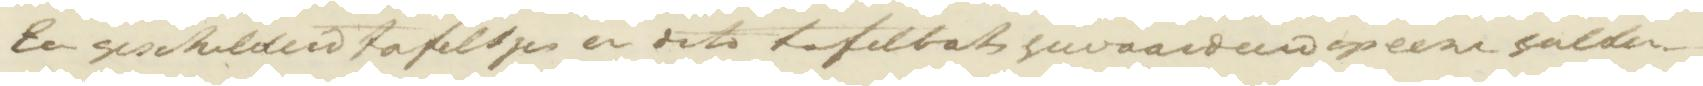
Een geschilderd tafeltjes en dito tafelbak gewaardeerd op eene gulden
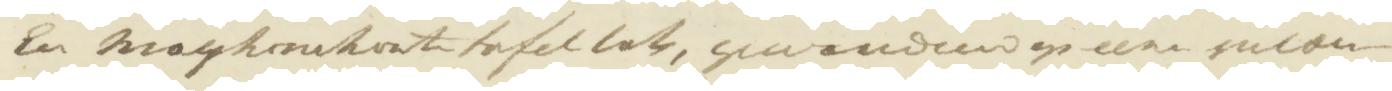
En maghonihouten tafelbak, gewaardeerd op eene gulden
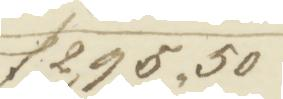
ƒ295„ 50
